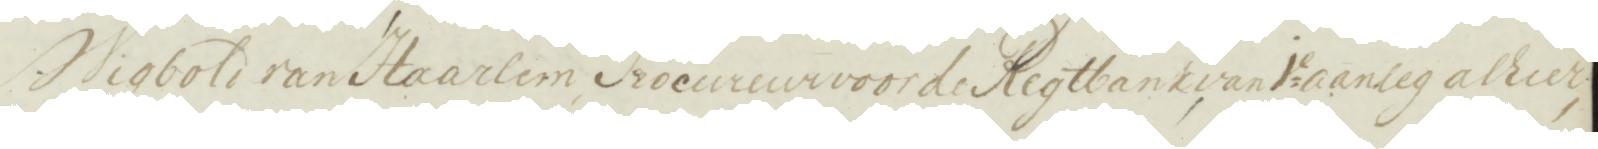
Wigbold van Haarlem, Procureur voor de Regtbank van 1=e aanleg alhier,
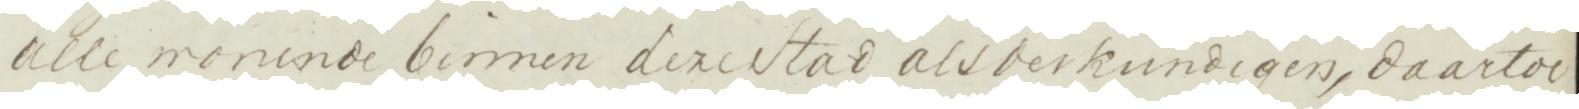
alle wonende binnen deze stad als deskundigen, daartoe
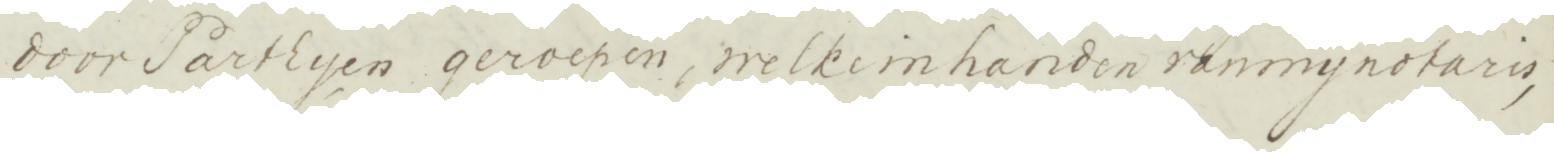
door Parthyen geroepen, welke in handen van mij notaris,
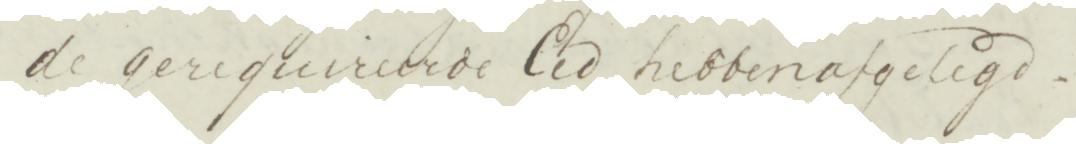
de gerequireerde Eed hebben afgelegd -
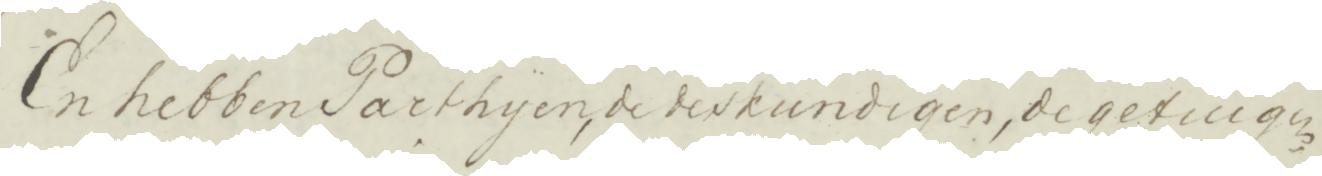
En hebben Parthijen, de deskundigen, de getuigen,
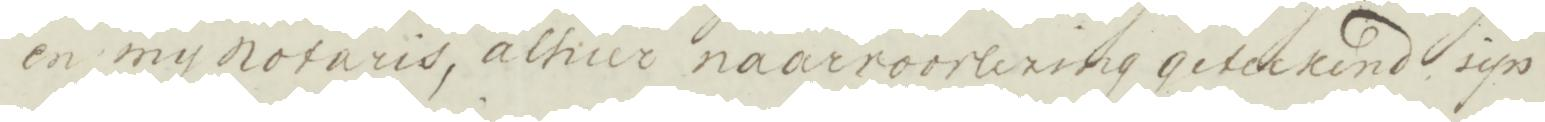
en mij notaris, alhier naar voorlezing geteekend zijn
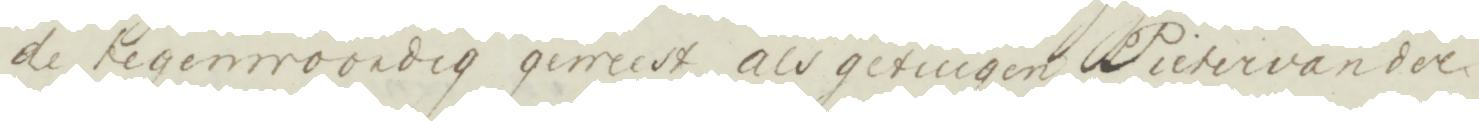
de tegenwoordig geweest als getuigen Pieter van der
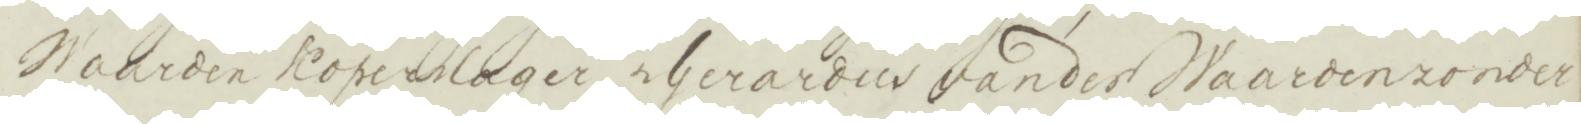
Waarden koperslager, Gerardus vander Waarden zonder
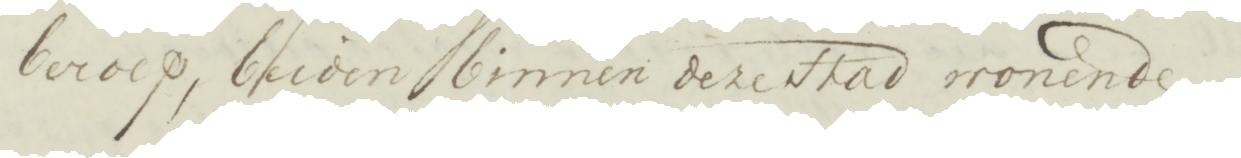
beroep, beiden binnen deze stad wonende.
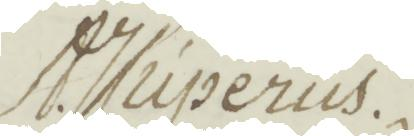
A.Kuperus.
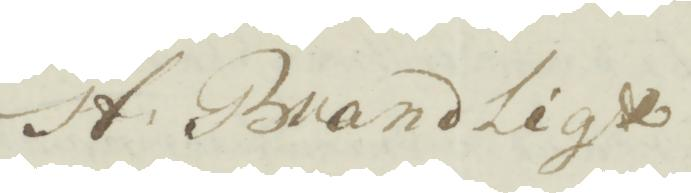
H: Brandlight
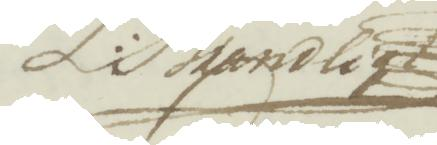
L:Brandligt
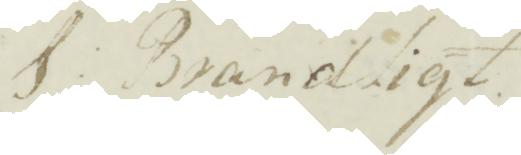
S: Brandligt.
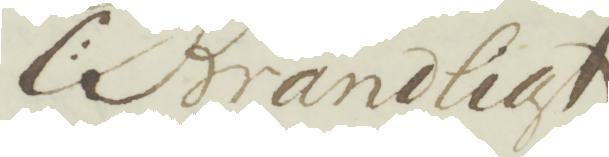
C: Brandligt
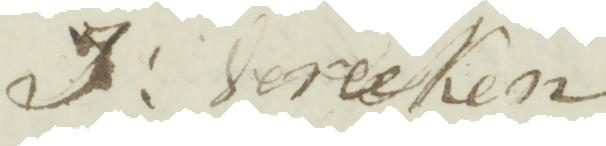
I: Vereeken
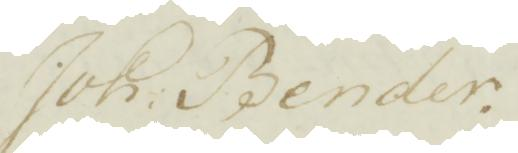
Joh: Bender.
